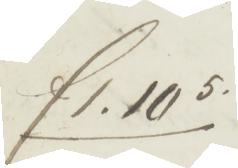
ƒ1.105
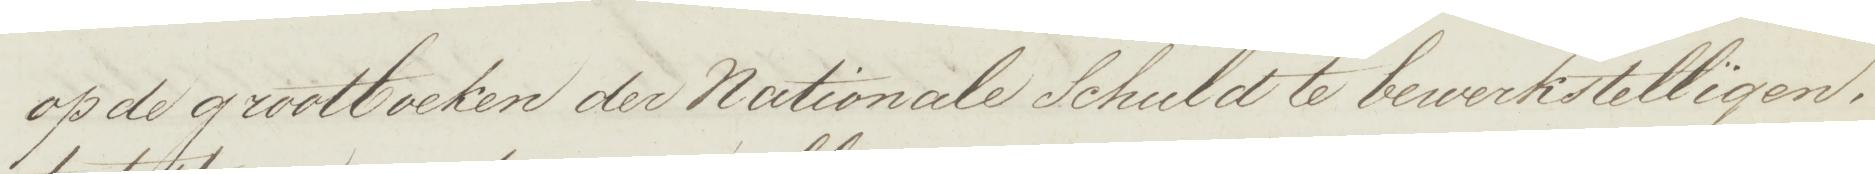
op de grootboeken der Nationale schuld te bewerkstelligen,
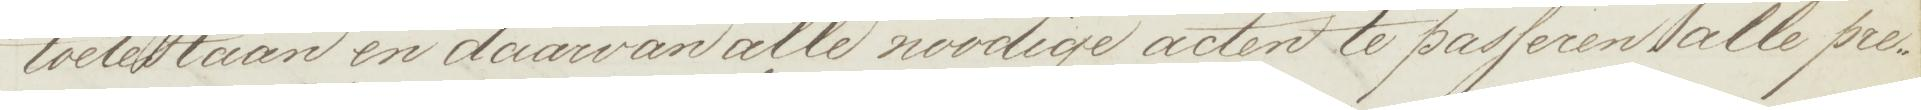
toetestaan en daarvan alle noodige acten te passeren alle pre„
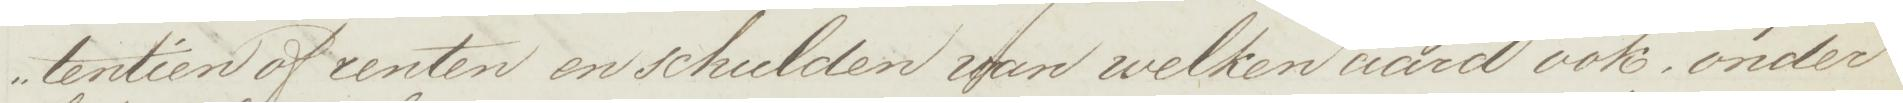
„tentien of renten en schulden van welken aard ook, onder
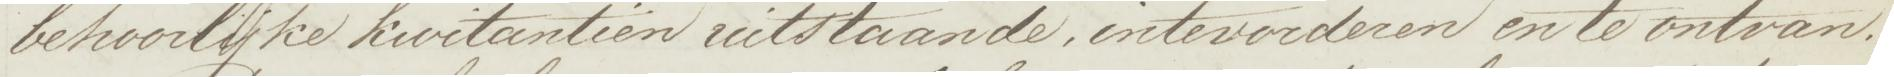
behoorlijke kwitantien uitstaande, intevorderen en te ontvan„
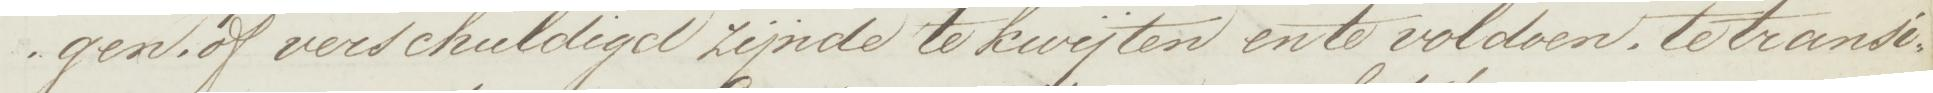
„gen, of verschuldigd zijnde te kwijten en te voldoen, te transi„
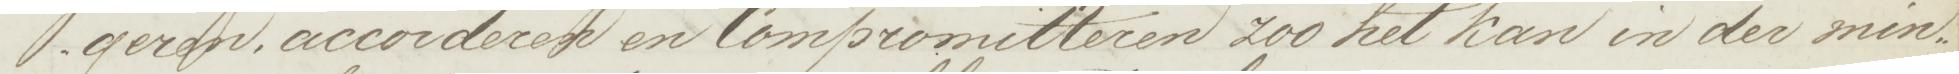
geren, accorderen en Compromitteren zoo het kan in der min„
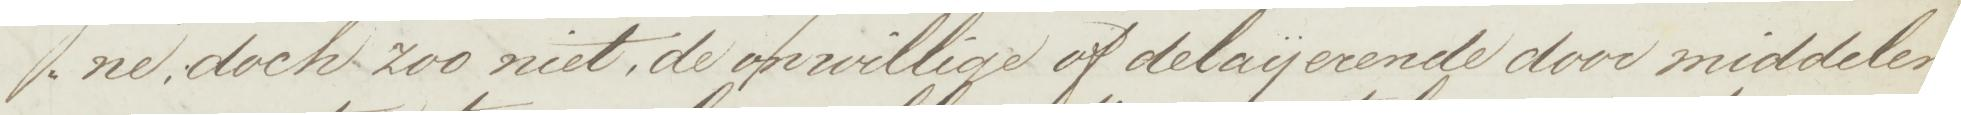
ne, doch zoo niet, de opwillige of delaijerende door middelen
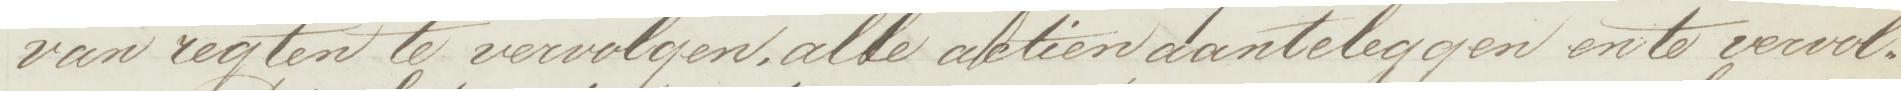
van regten te vervolgen, alle actien aanteleggen en te vervol„
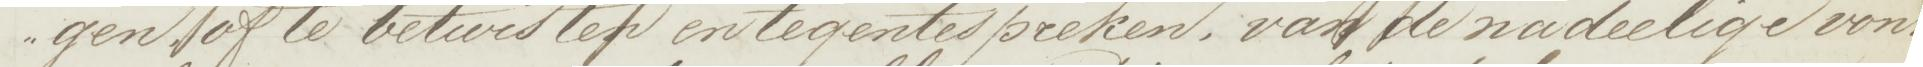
„gen, of te betwisten en tegentespreken, van de nadeelige von„
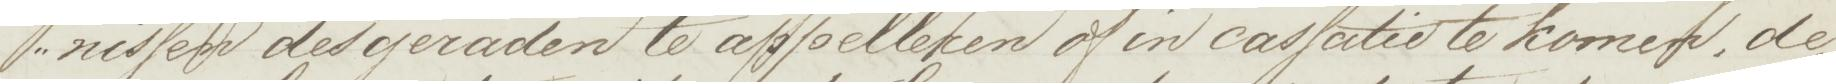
„nissen desgeraden te appelleren of in cassatie te komen, de
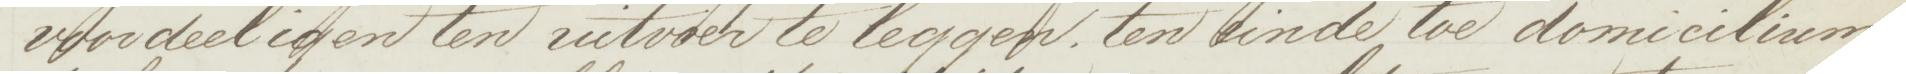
voordeeligen ten uitvoer te leggen, ten einde toe domicilium
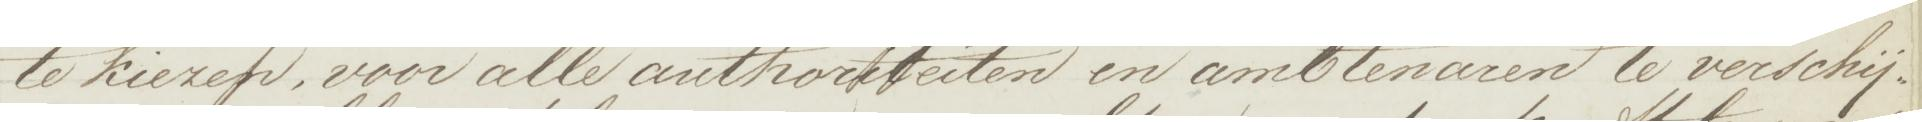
te kiezen, voor alle authoriteiten en ambtenaren te verschij„
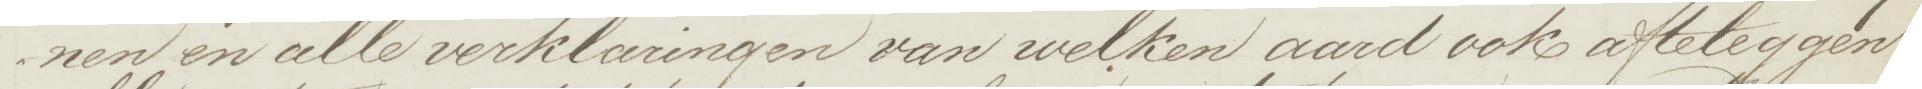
„nen en alle verklaringen van welken aard ook afteleggen,
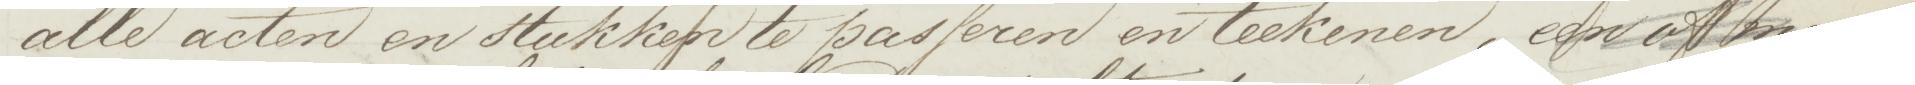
alle acten en stukken te passeren en teekenen, een off meer
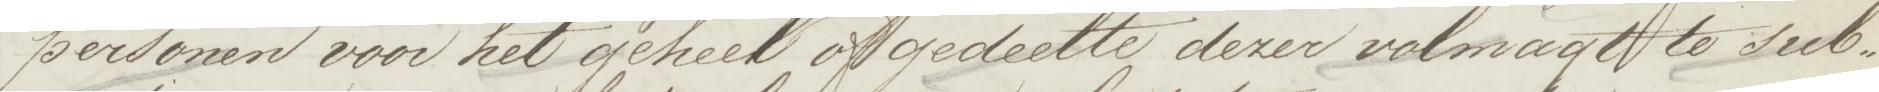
personen voor het geheel of gedeelte dezer volmagt te sub„
